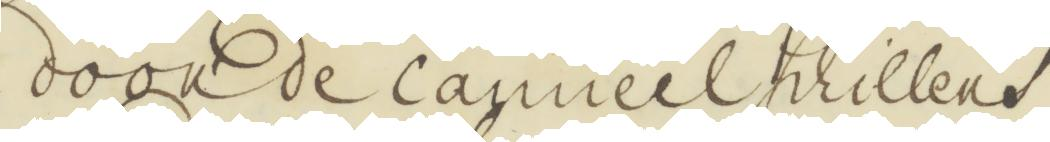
door de canneel schillers
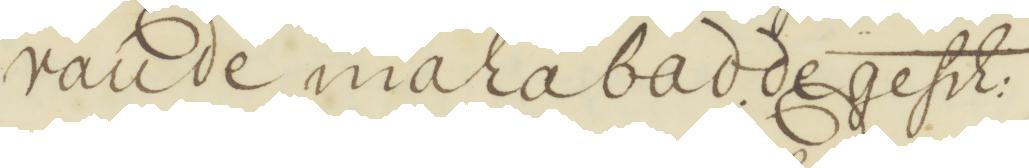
van de mahabadde gesch:
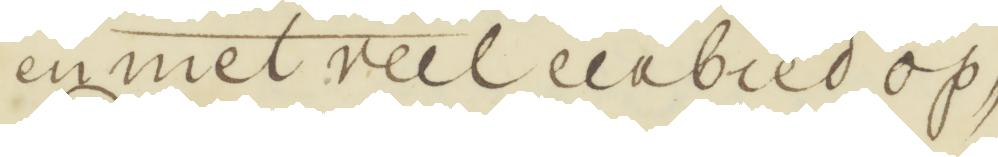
en met veel eerbied op
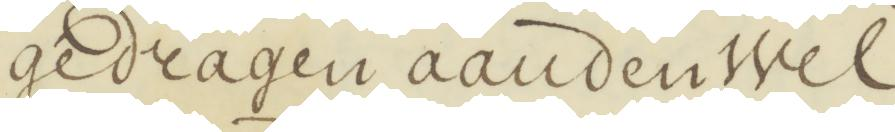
gedragen aan den Wel
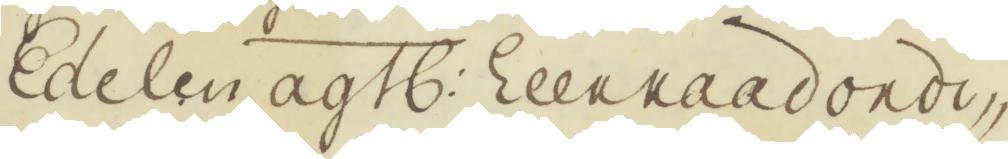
Edelen agtb: heer raad ordi„
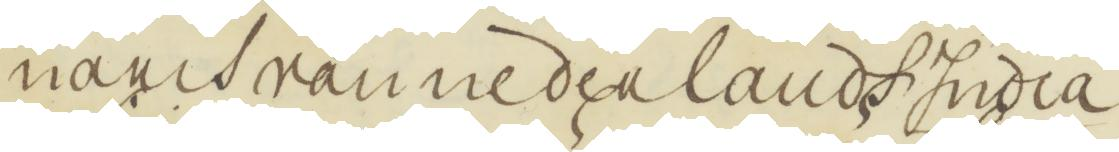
naris van nederlands Jndia
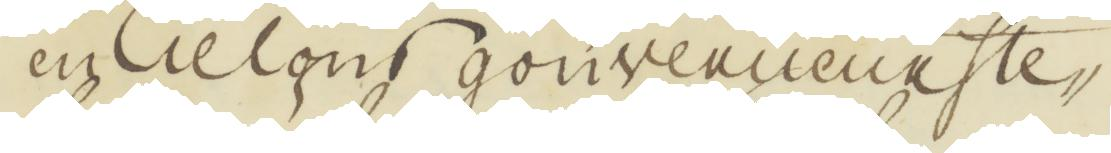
en Cielons gouverneur ste„
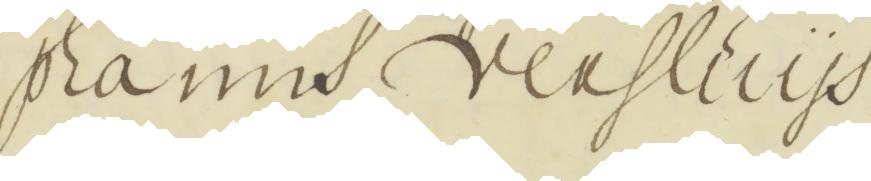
phanus Versluijs
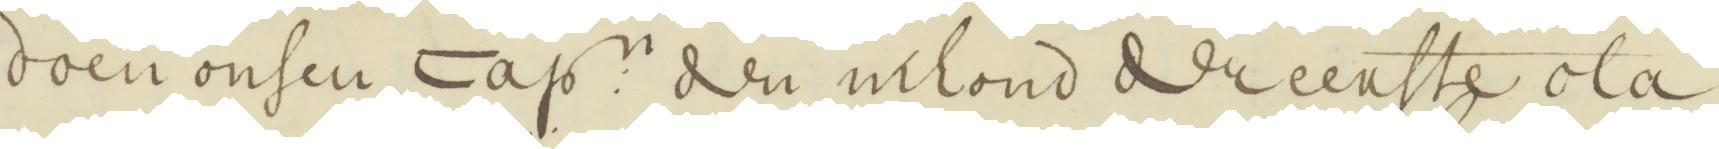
doen onsen Cap.n den inhoud der eerste ola
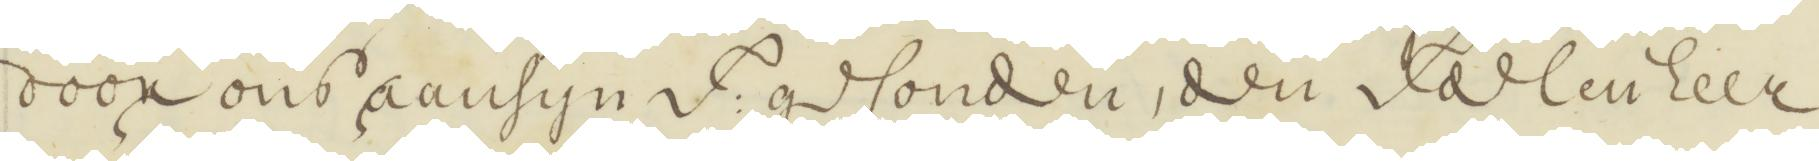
door ons aan sijn E: gesonden, den Edelen heer
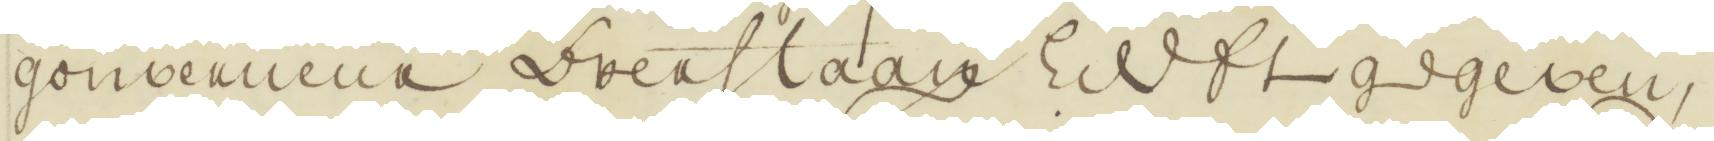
gouverneur teverstaan heeft gegeven,
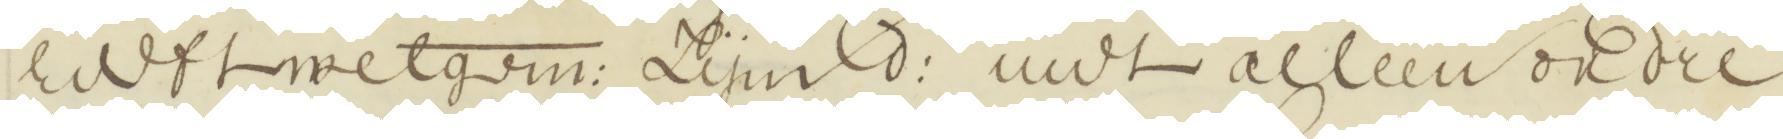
heeft welgem: Zijn Ed: niet alleen ordre
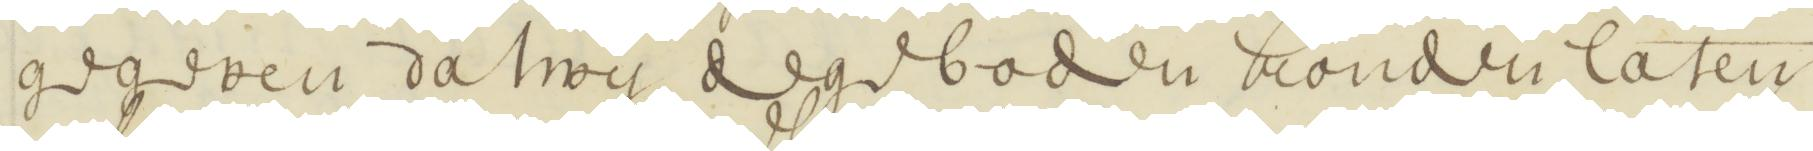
gegeven dat wij de geboden konden laten
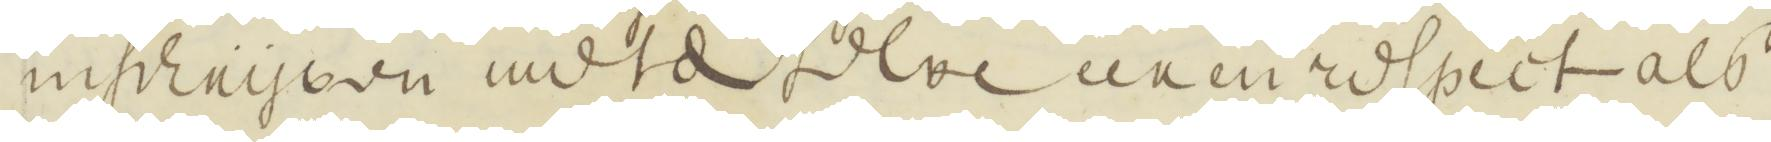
inschrijven met deselve eer en respect als
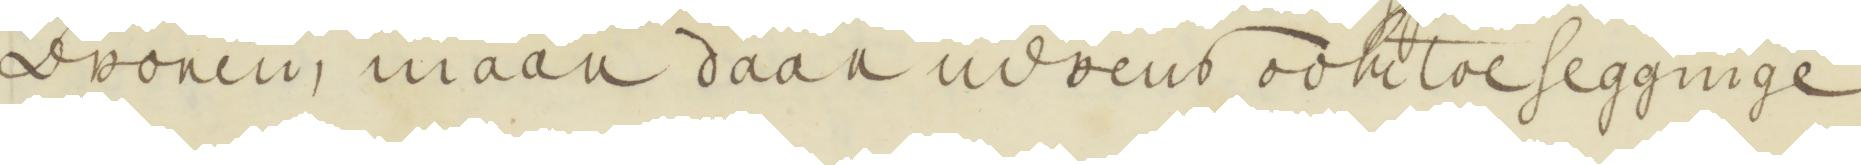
tevoren, maar daar nevens ook toe segginge
